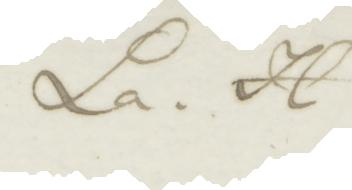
La. H
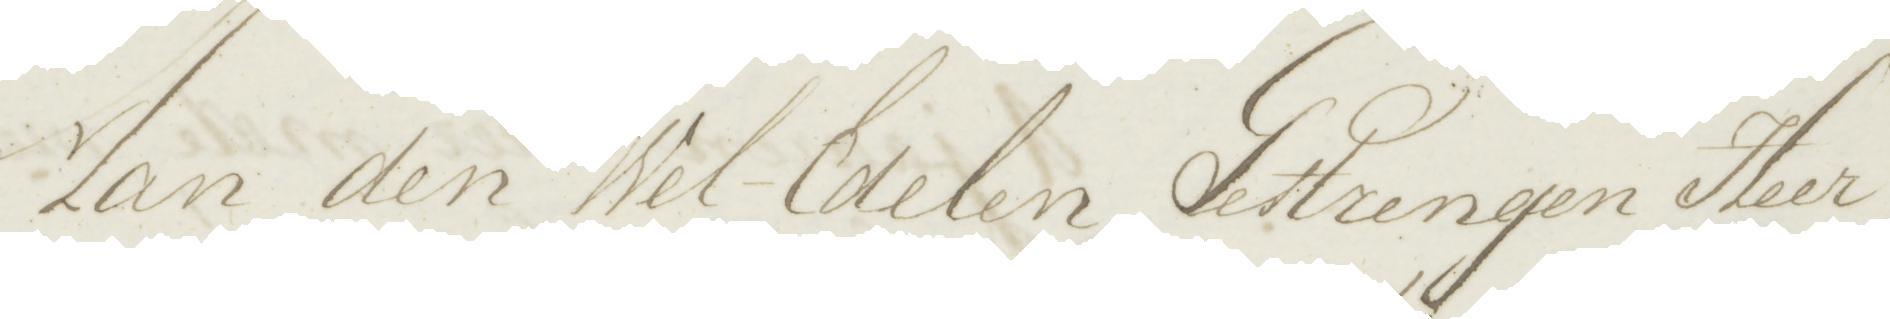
Aan den Wel Edelen Gestrengen Heer
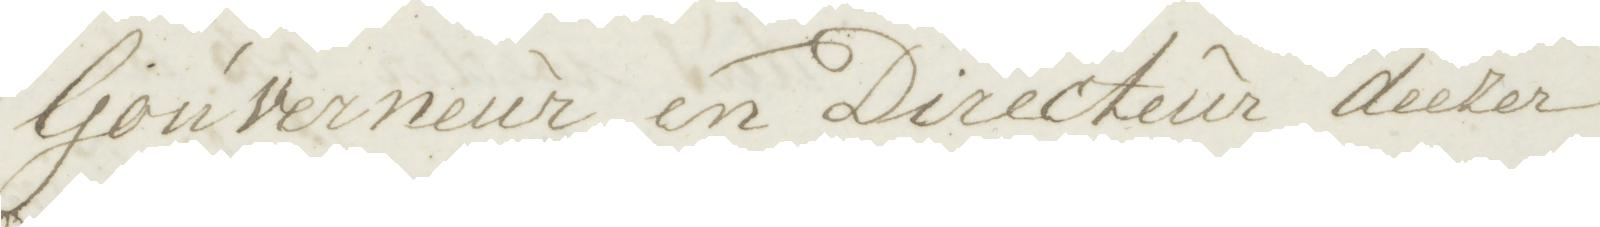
Gouverneur en Directeur deezer
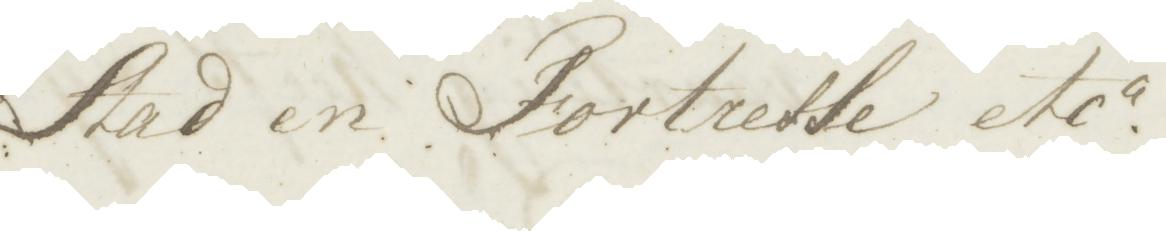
Stad en Fortresse Etc:a.
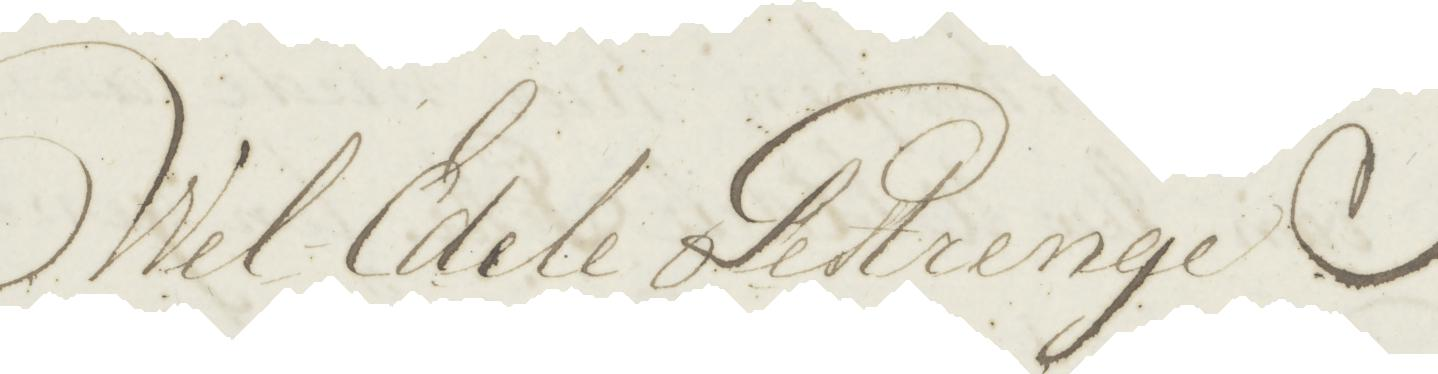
Wel Edele Gestrenge Heer,
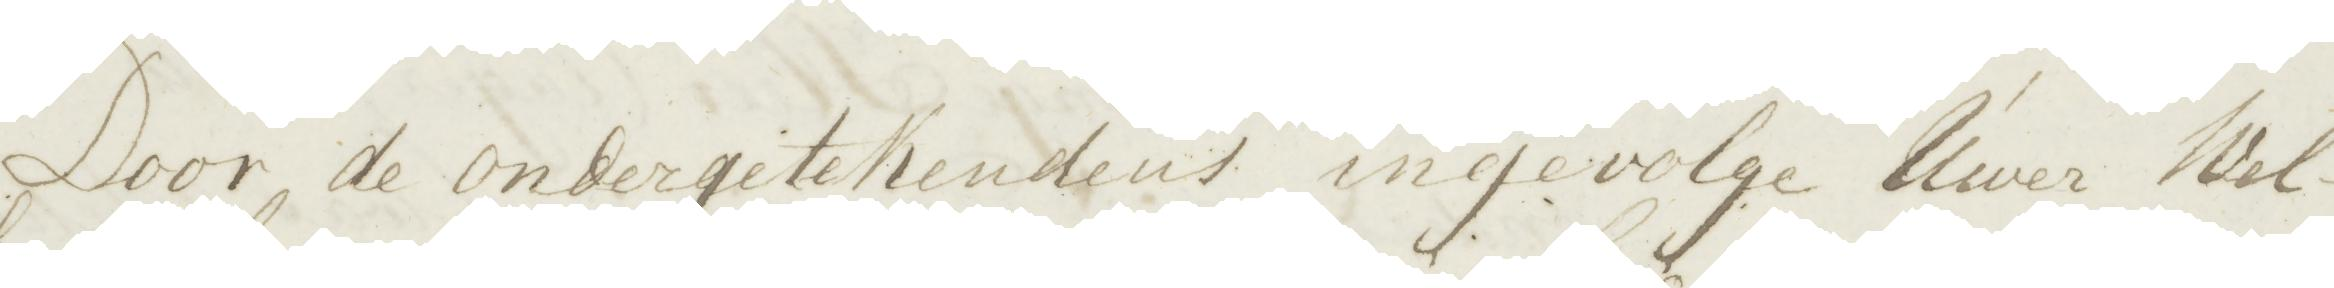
Door de ondergetekendens ingevolge Uwer Wel
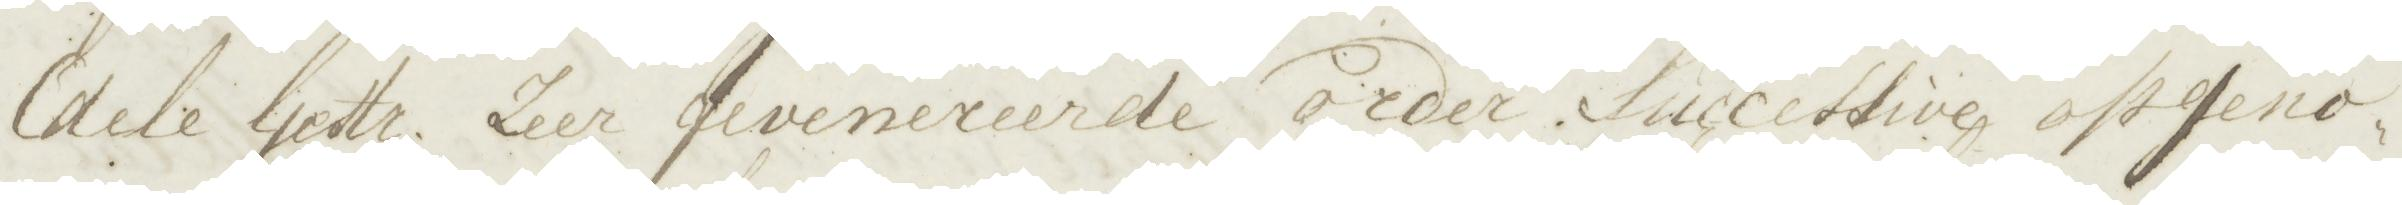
Edele Gestr. Zeer gevenereerde order Successive opgeno„
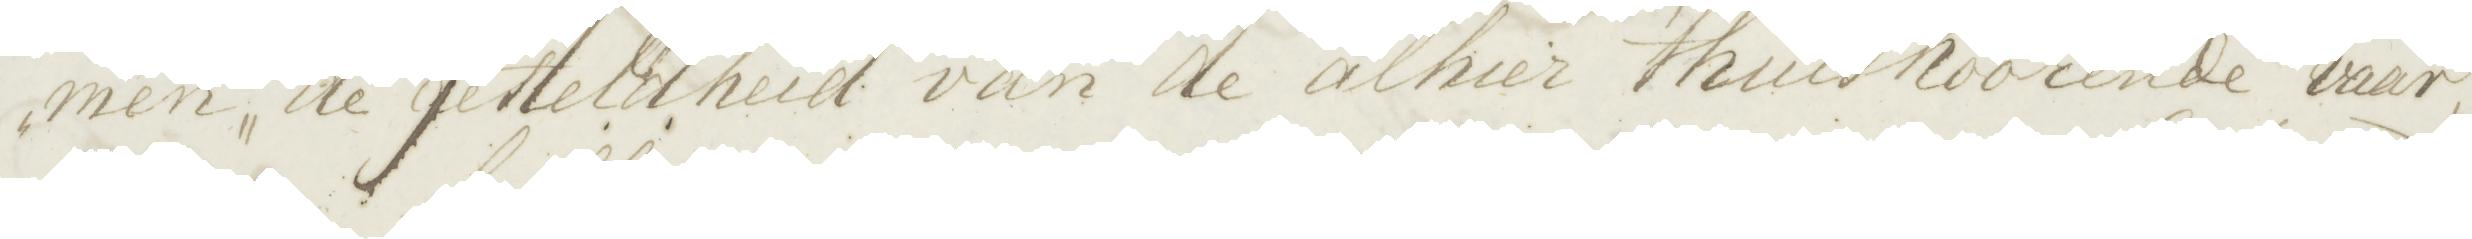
„men „ de gesteltheid van de alhier thuis hoorende vaar„
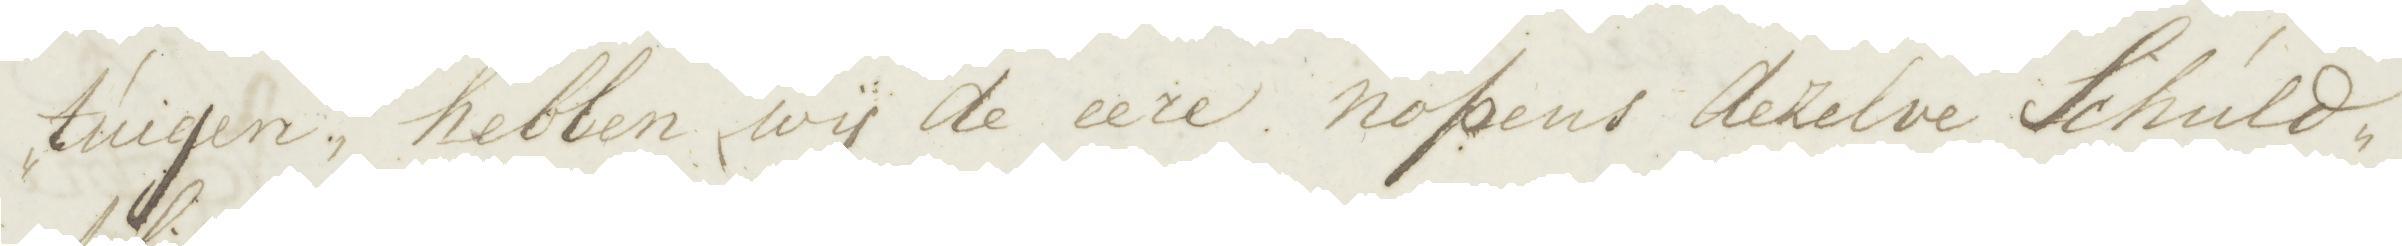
„tuigen, hebben wij de eere nopens dezelve Schuld„
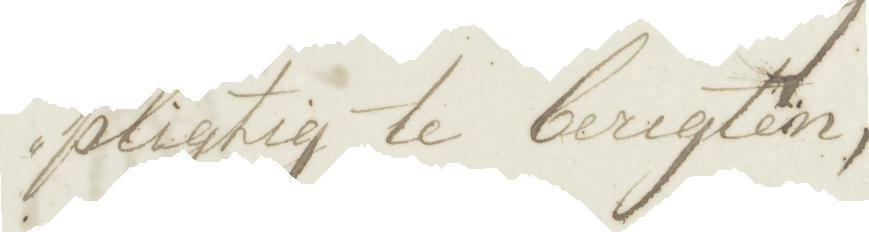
„pligtig te berigten,
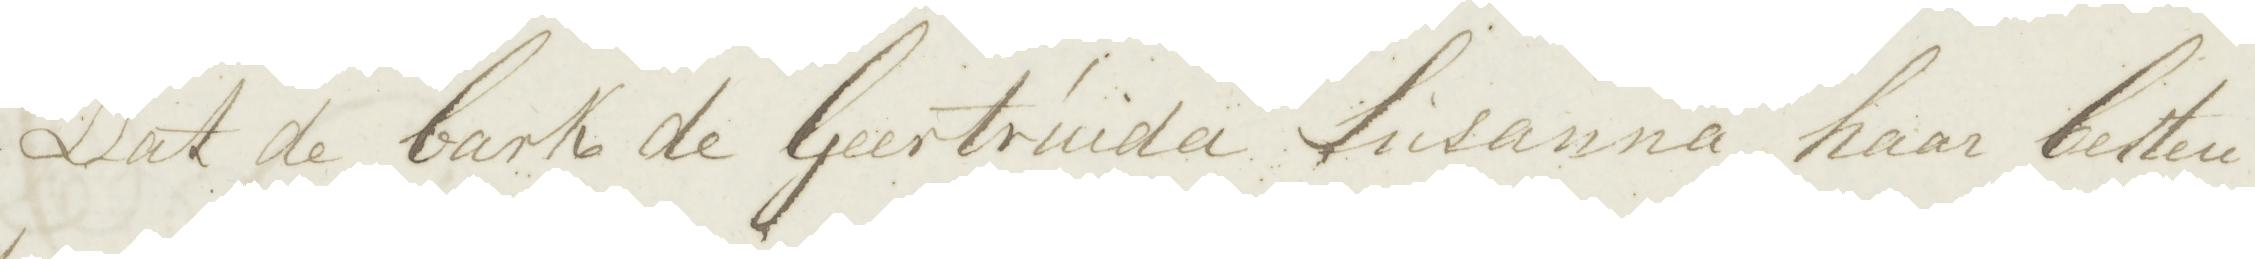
Dat de bark de Geertruida Susanna haar besten
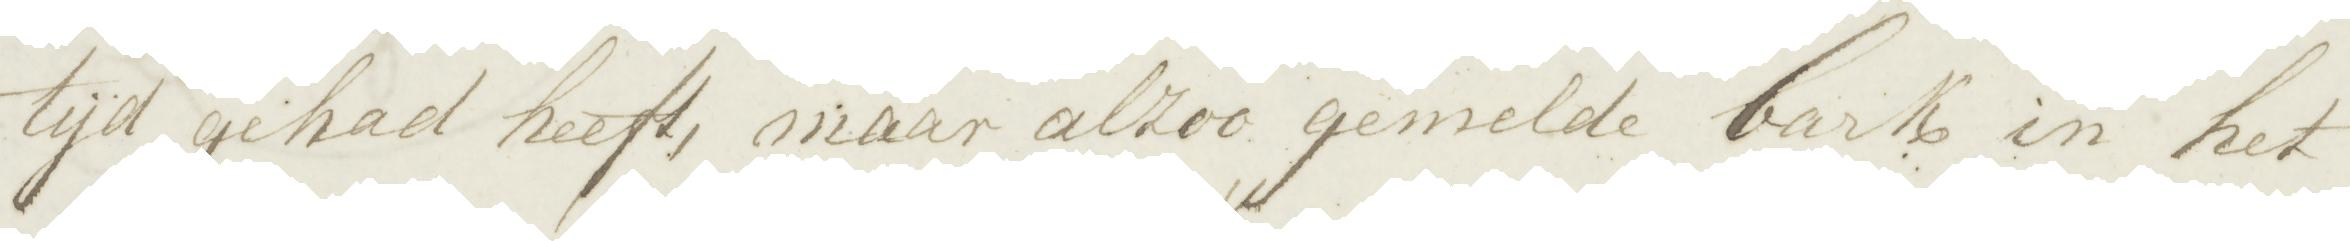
tijd gehad heeft, maar alzoo gemelde bark in het
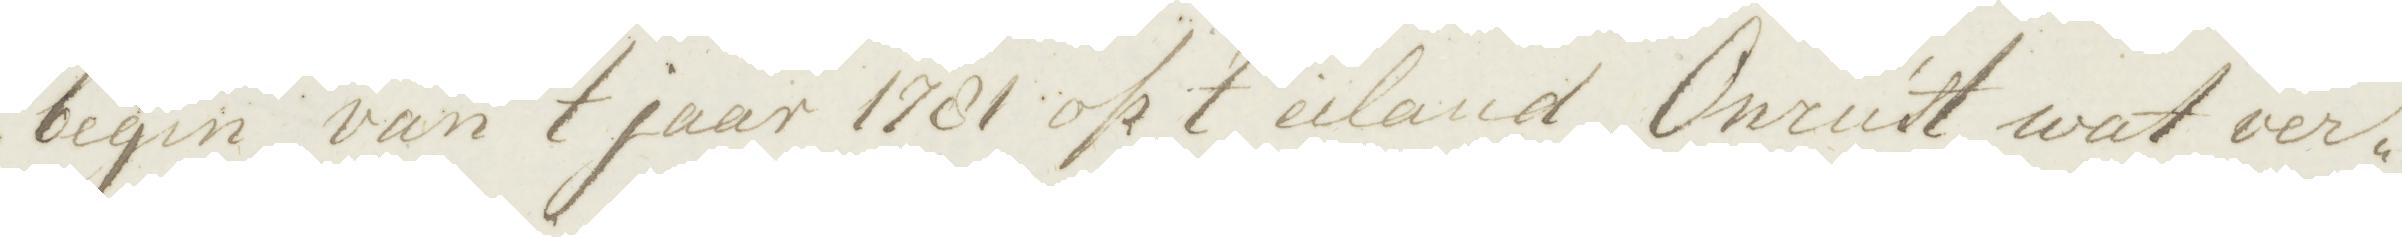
begin van 't jaar 1781 op ’t eiland Onrust wat ver„
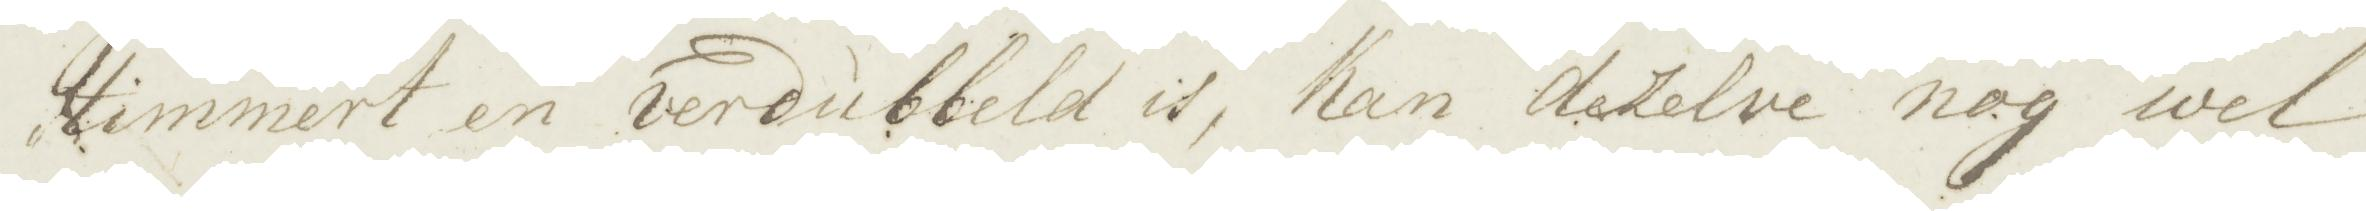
„timmert en verdubbeld is, Kan dezelve nog wel
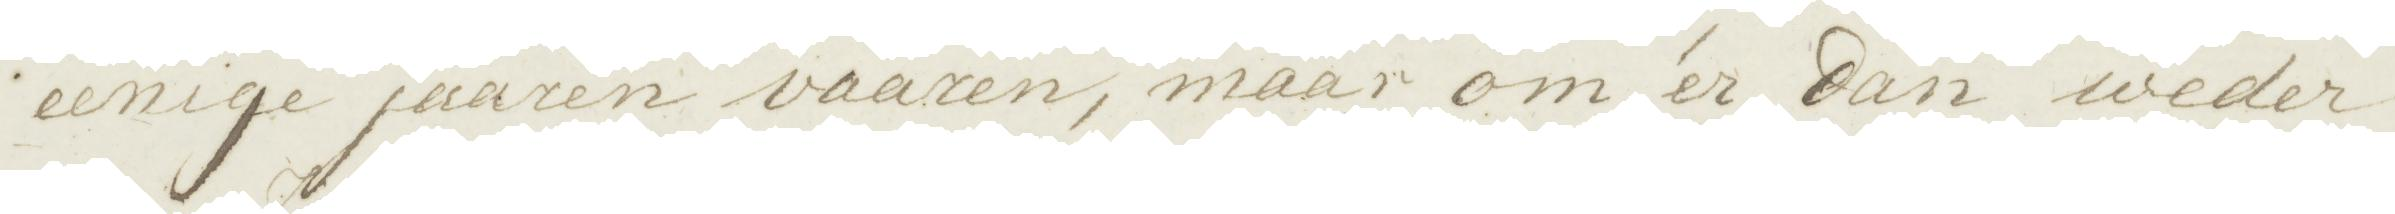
eenige jaaren vaaren, maar om er dan weder
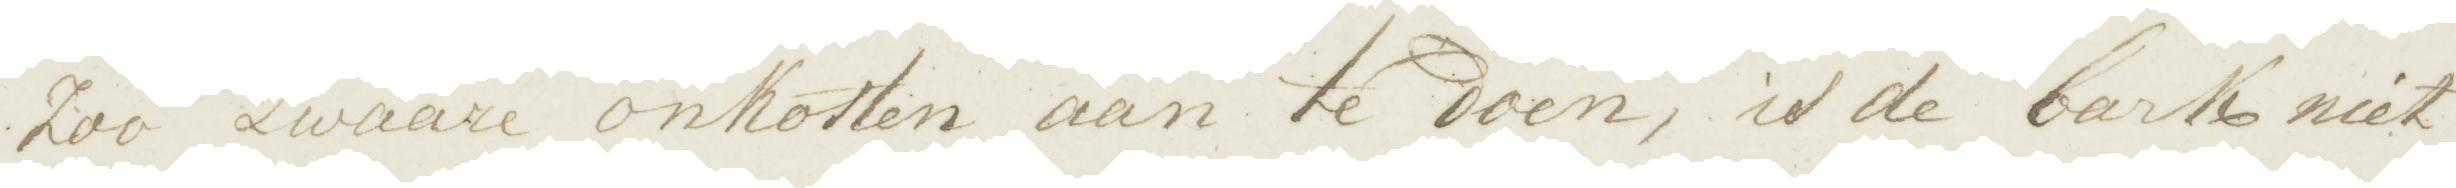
Zoo Zwaare onkosten aan te doen, is de bark niet
